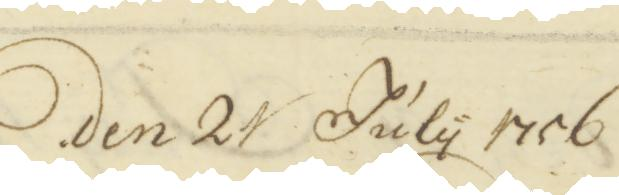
den 21' Julij 1756
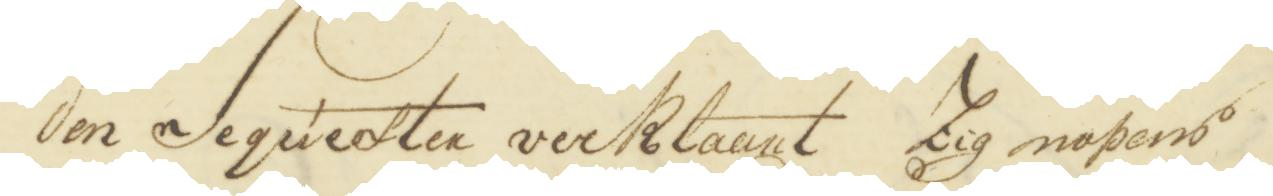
den Sequester verklaart zig nopens
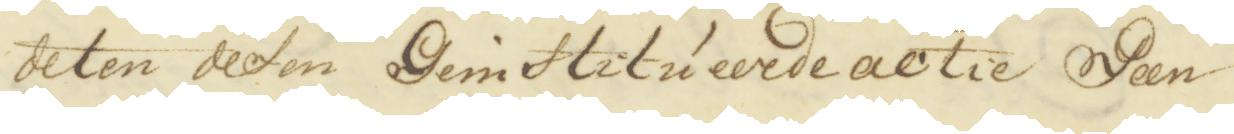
de ten desen Geinstitueerde actie Geen
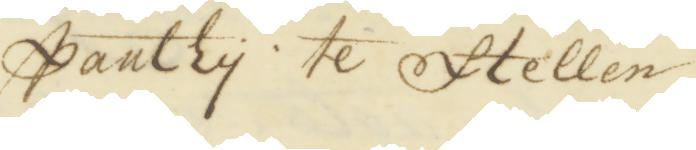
parthij te stellen
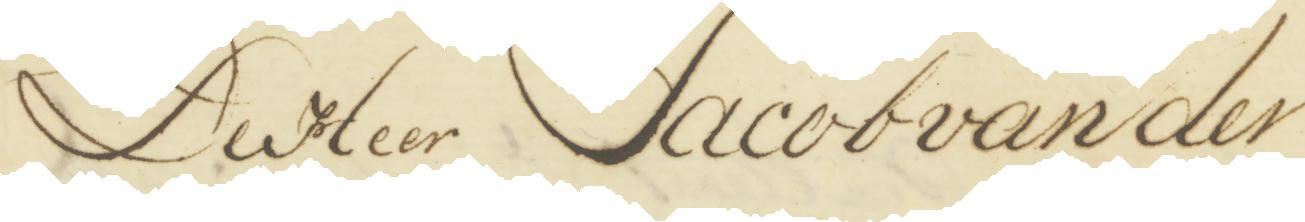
De Heer Jacob van der
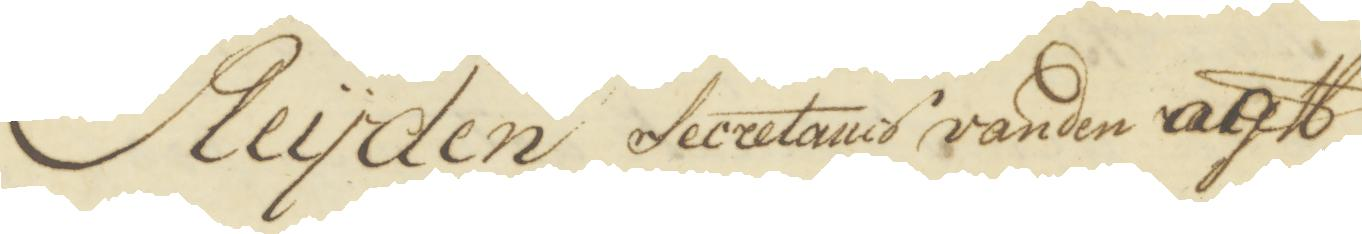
Sleijden Secretaris van den agtb
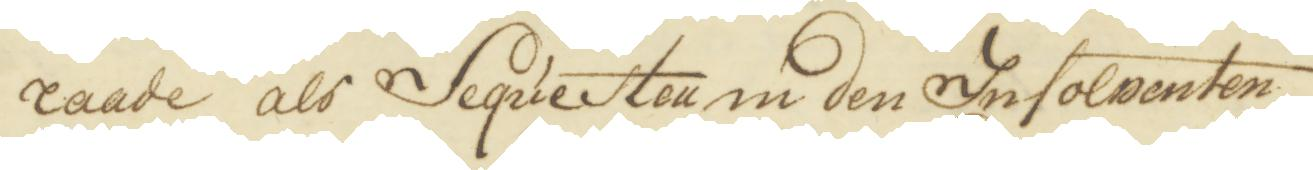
raade als Sequester in den Insolventen
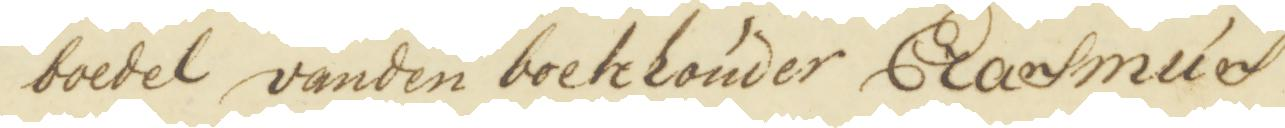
boedel vanden boekhouder Erasmus
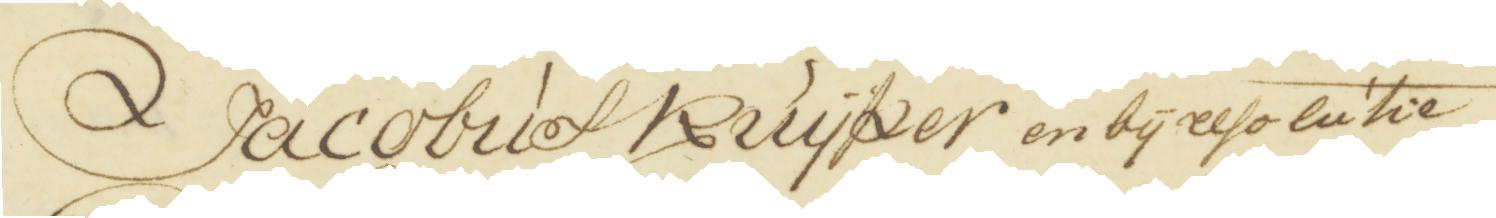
Jacobus Kuijper en bij resolutie
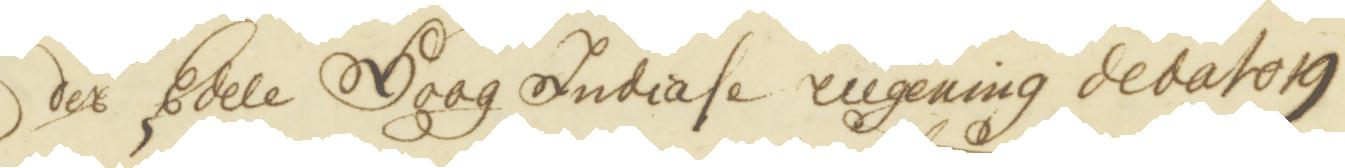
der Edele Hoog Indiase reegering de dato 19
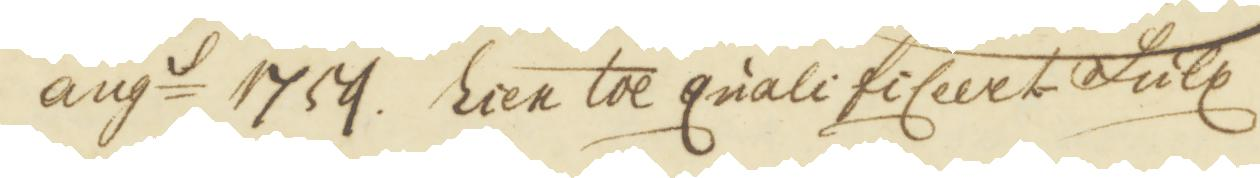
aug=s 1754. hier toe qualificeert sulx
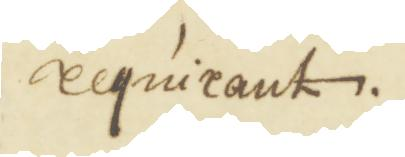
requirant.
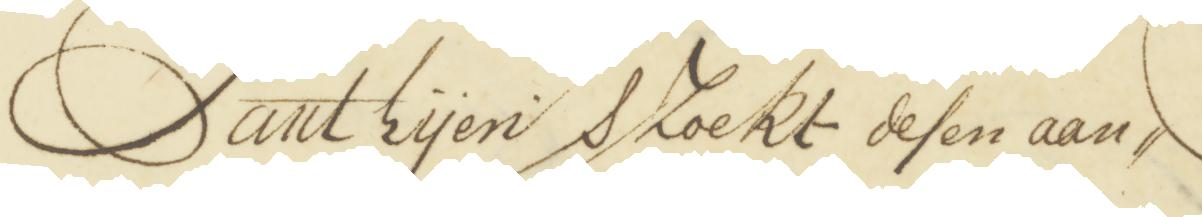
Parthijen verzoekt desen aan„
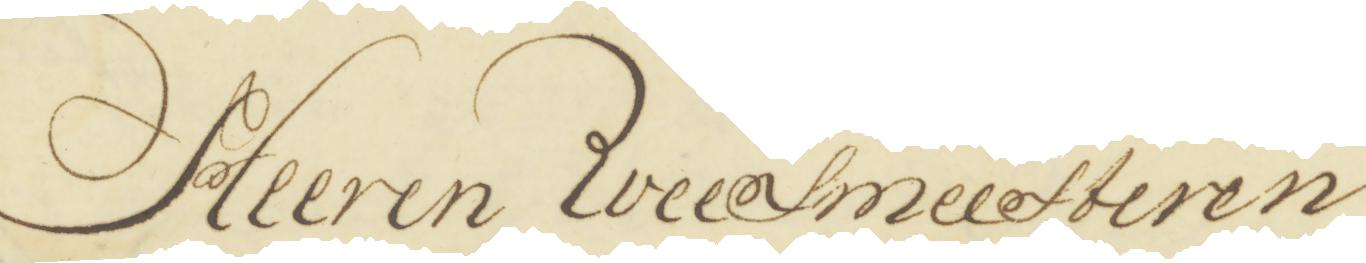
Heeren weesmeesteren
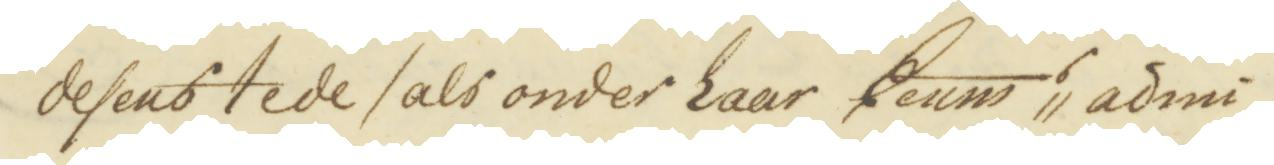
desers tede /als onder haar Eerw„s admi
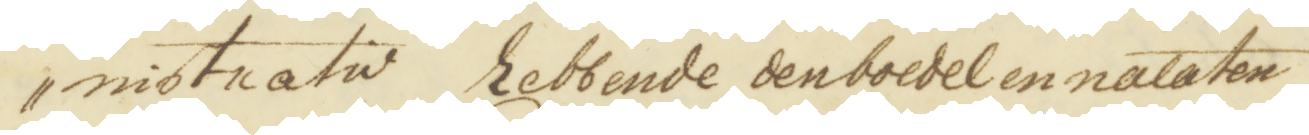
„nistratie hebbende den boedel en nalaten
